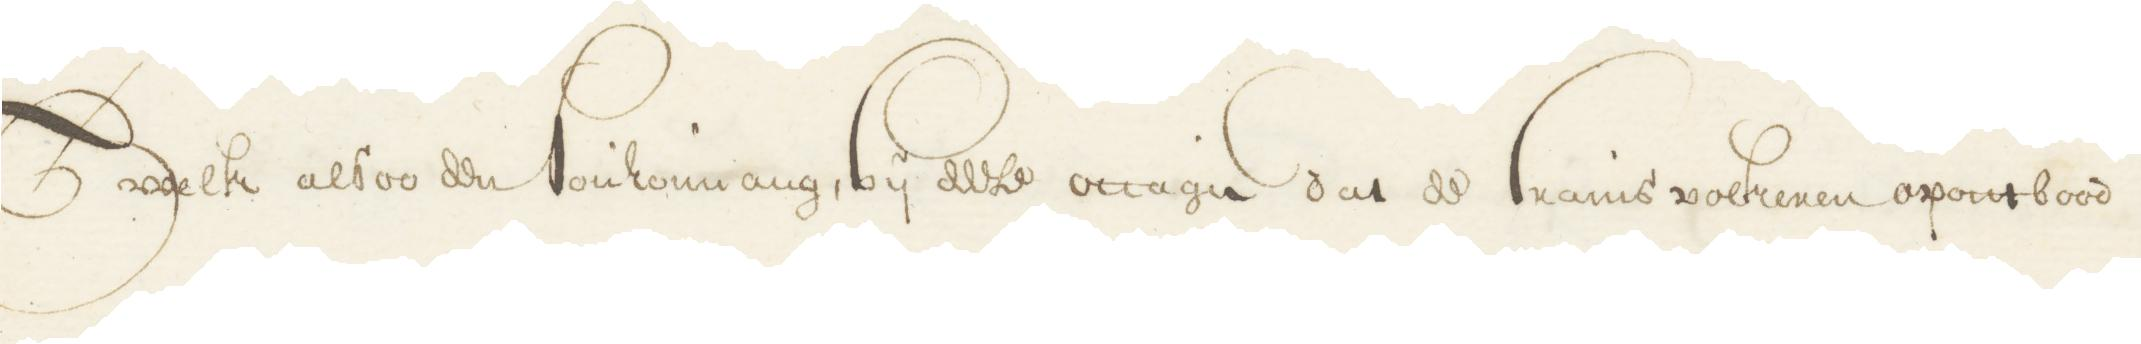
T welk alsoo den Souhounang, bij deese occagie dat de trains volkeren opontbood
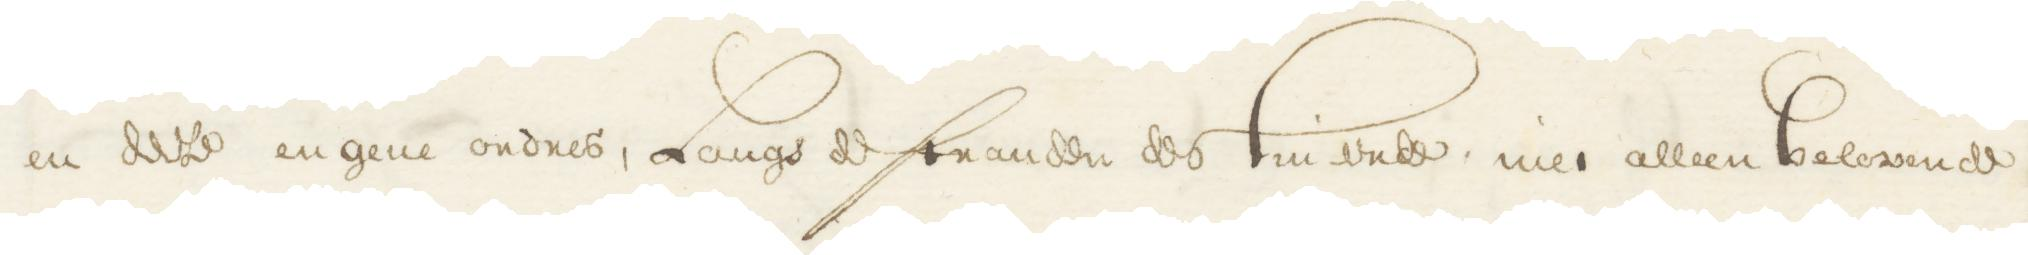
en deese en gene ordres, Langs de stranden destineerde niet alleen belovende
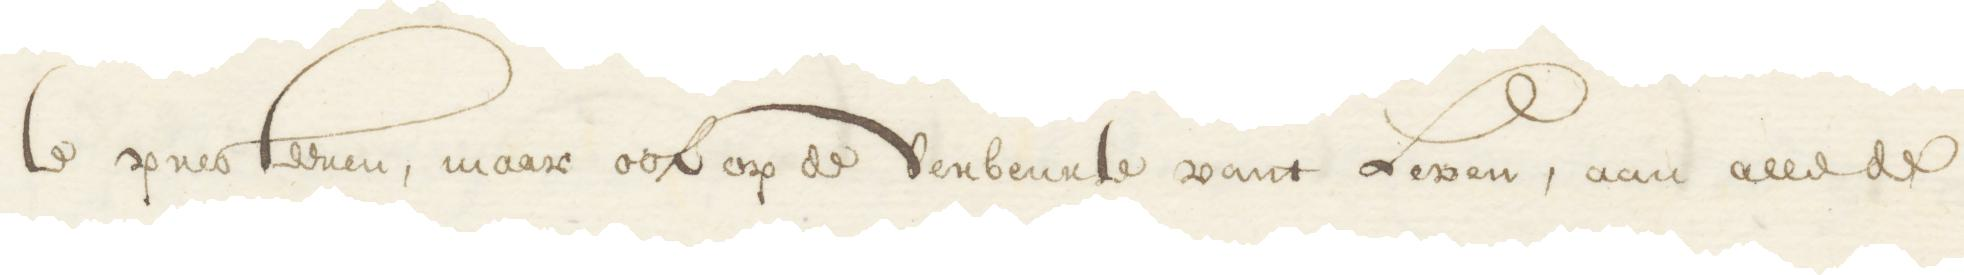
te presteeren, maar ook op de verbeurte vant leven, aan alle de
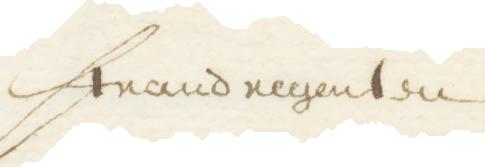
strand regenten
